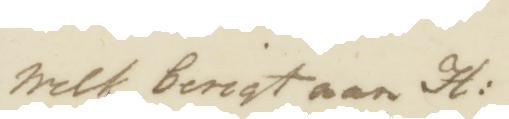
welk berigt aan H:
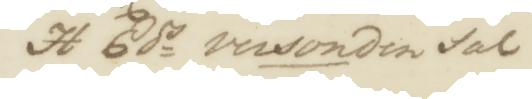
H Ed=s versonden sal
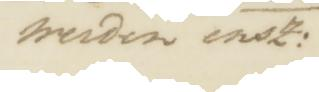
werden ensz:
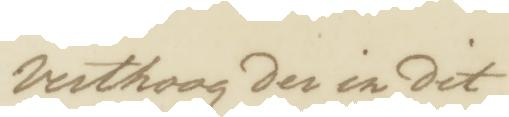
verthoog den in dit
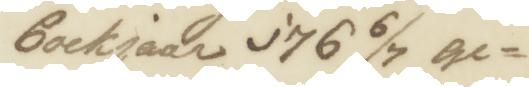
boekjaar 176 6/7 ge=
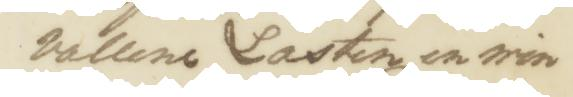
vallene Lasten en win
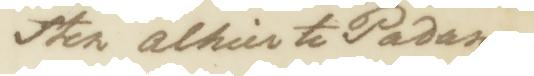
ster alhier te Padan
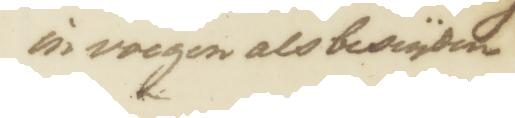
in voegen als beseijden
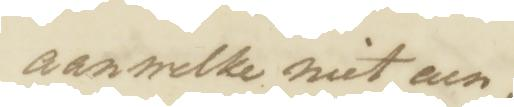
aan welke met aen
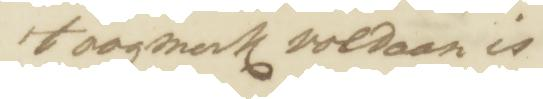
't oogmerk voldaan is
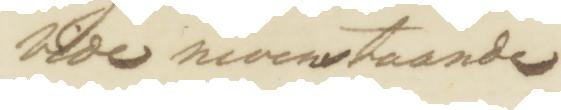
vide nevenstaande
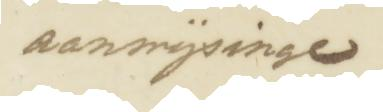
aanwijsinge
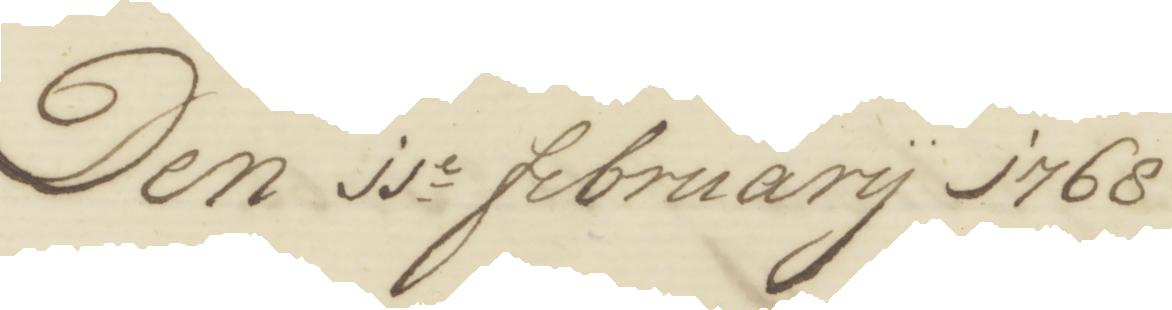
Den 11=e februarij 1768
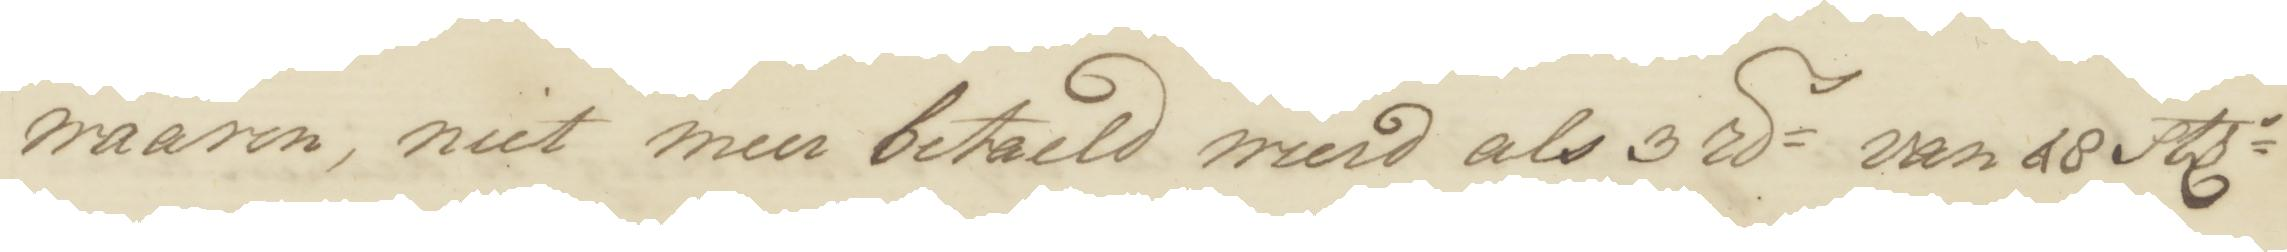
waaren, niet meer betaeld wierd als 3 rd=s van 48 stver=s
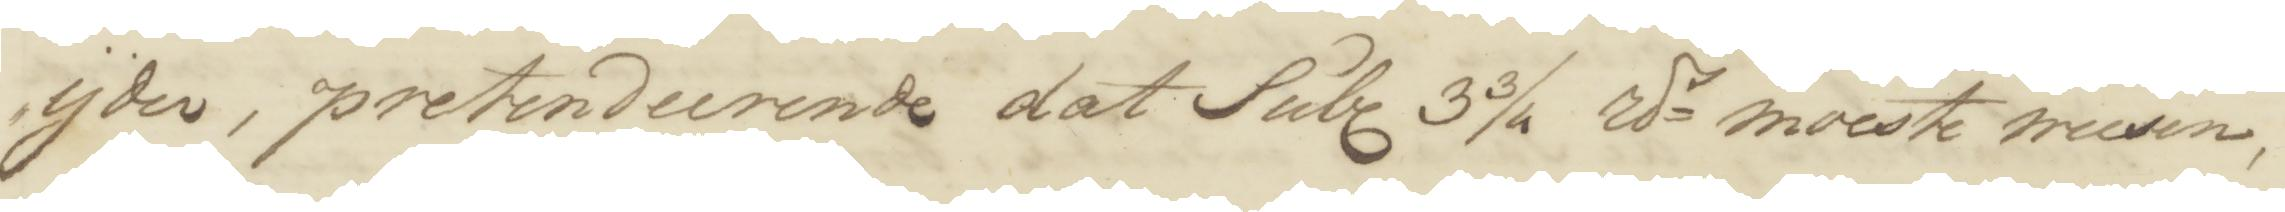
„ijder, pretendeerende dat sulx 3¾ rd=s moeste weesen,
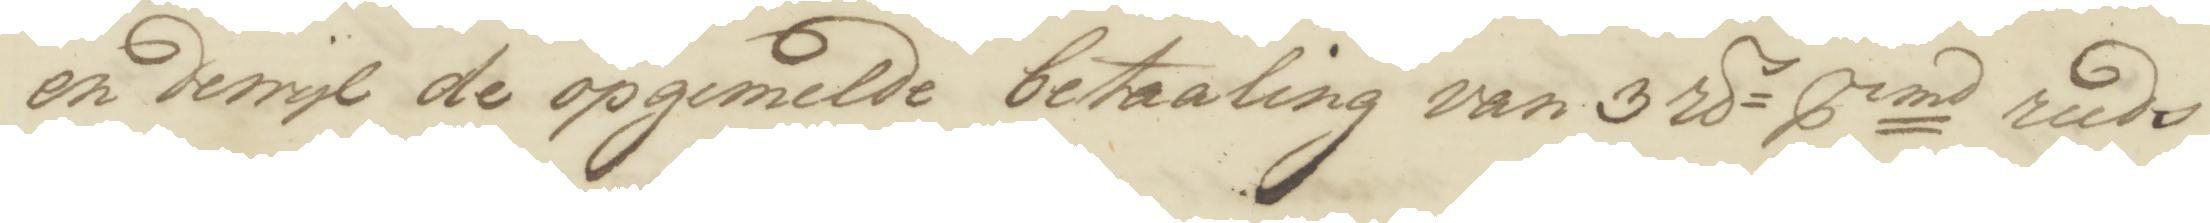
en dewijl de opgemelde betaaling van 3 rd=s p=md reeds
